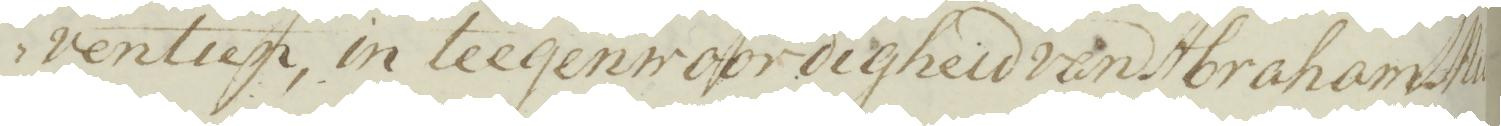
„ventien, in teegenwoordigheid van Abraham M
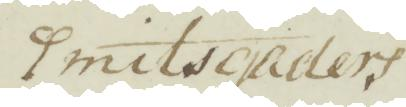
¶ mitsgaders
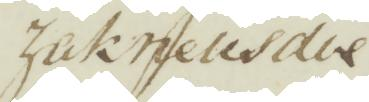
Zakneusdoe
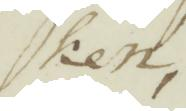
ken,
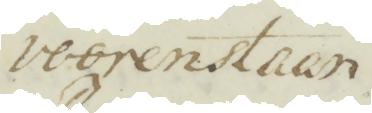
voorenstaan
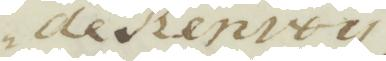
„de Renvoy
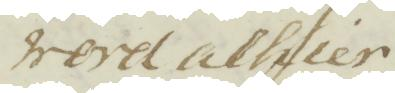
werd alhier
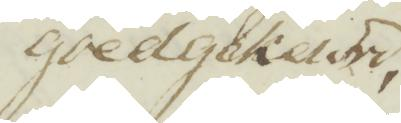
goedgekeudr.
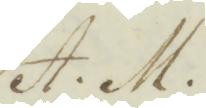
A. M.
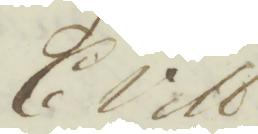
C V M
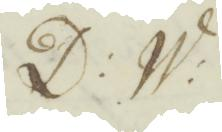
D: W:
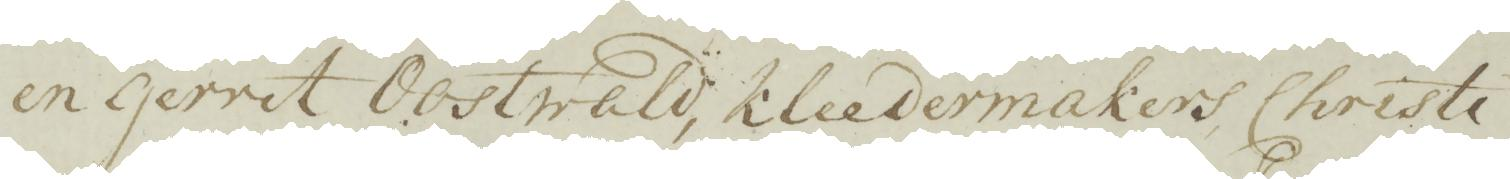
en Gerrit Oostwald, kleedermakers Christi
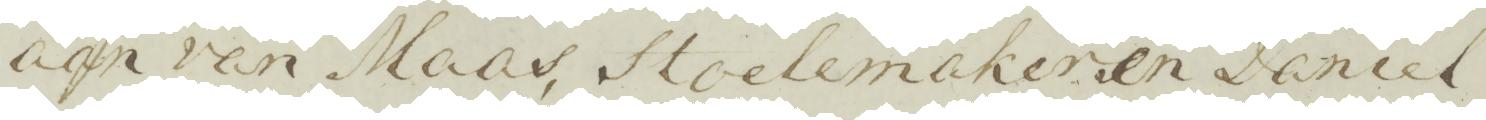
aan van Maas, stoelemaker en Daniel
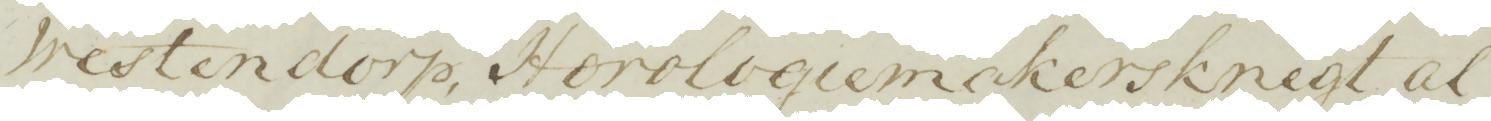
Westendorp, Horologiemakersknegt, al
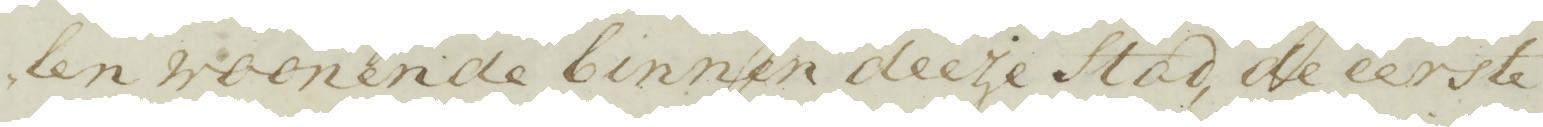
„len woonende binnen deeze stad, de eerste
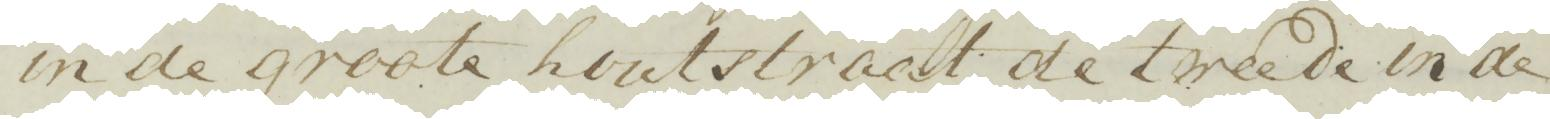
in de groote houtstraat, de tweede in de
